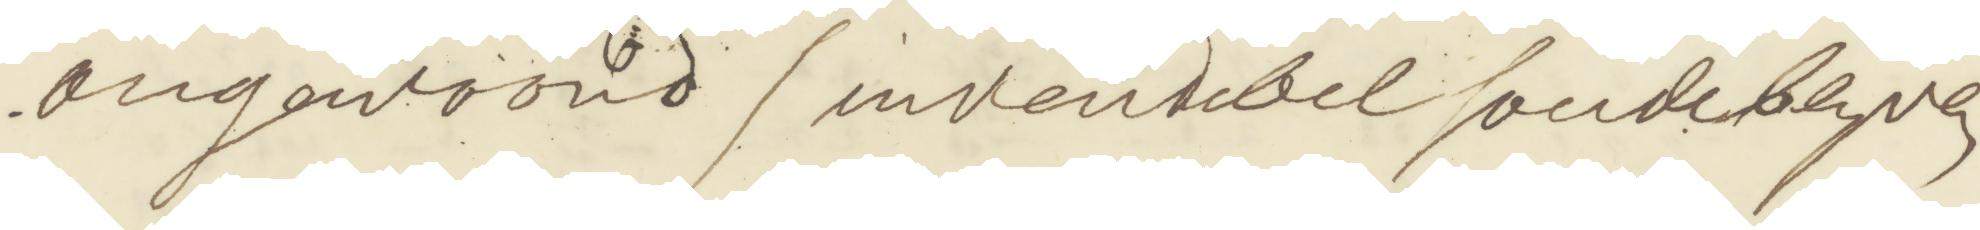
ongewoond / invendibel soude blijven
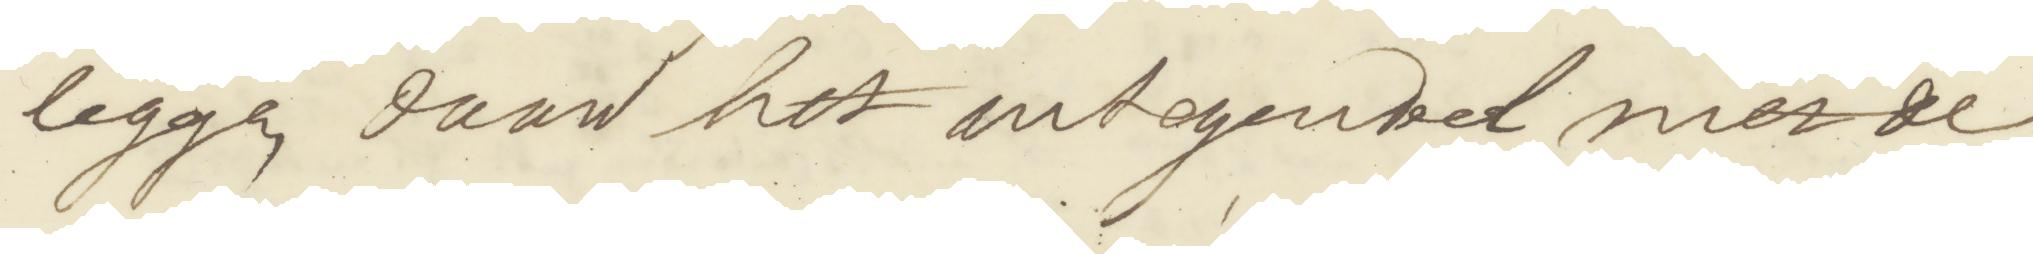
leggen daar het integendeel met de
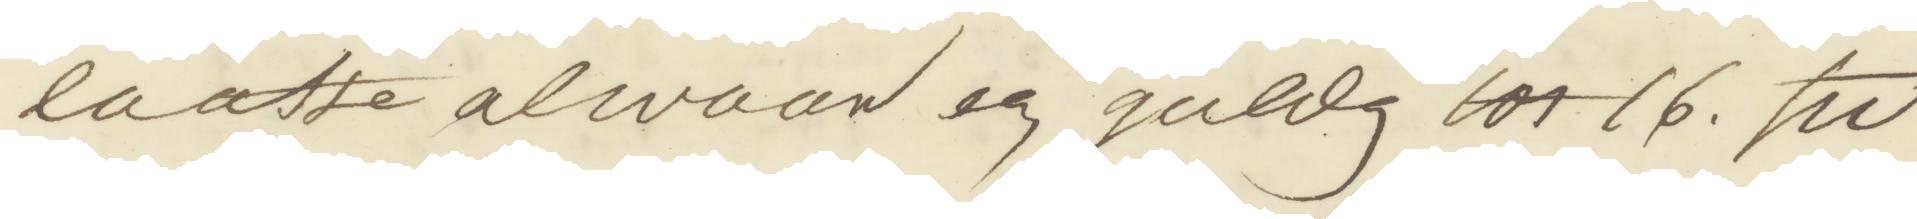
laaste alwaar een gulden tot 16. stu
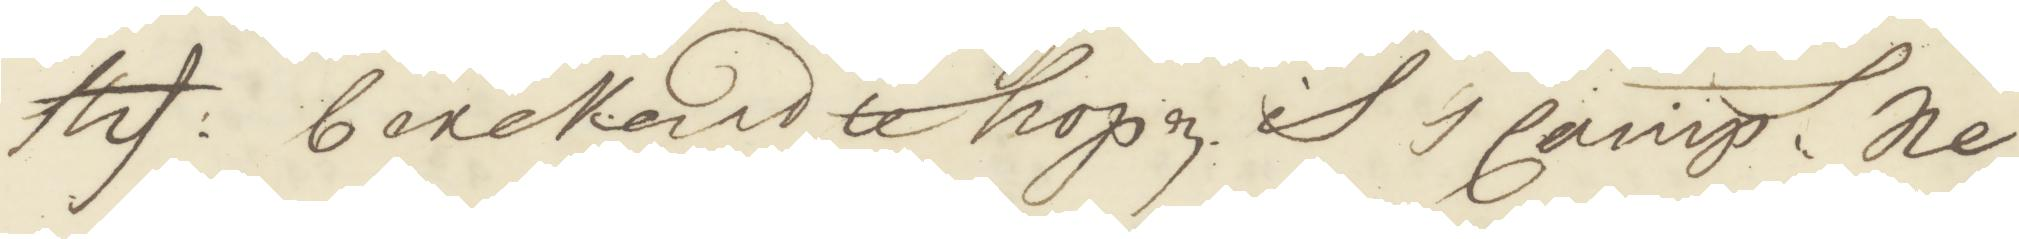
vers: berekend te hopen is ’s Comp:s ne;
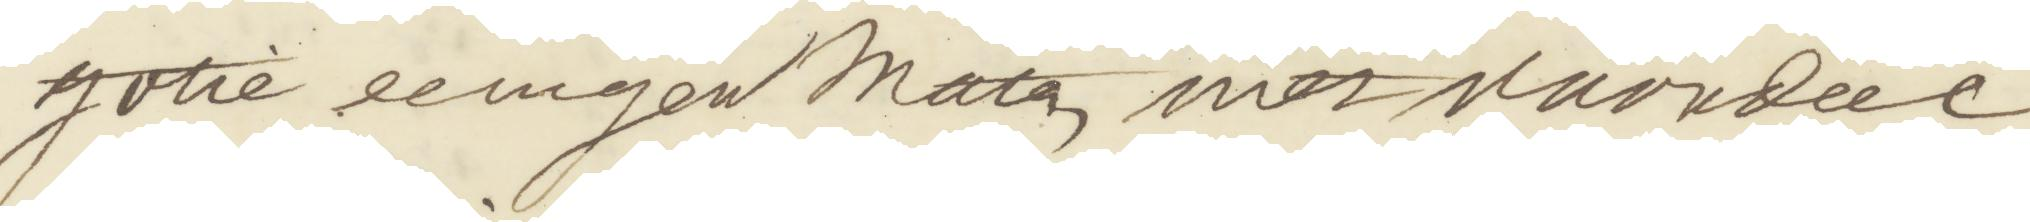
gotie eenigen maten met voordeel
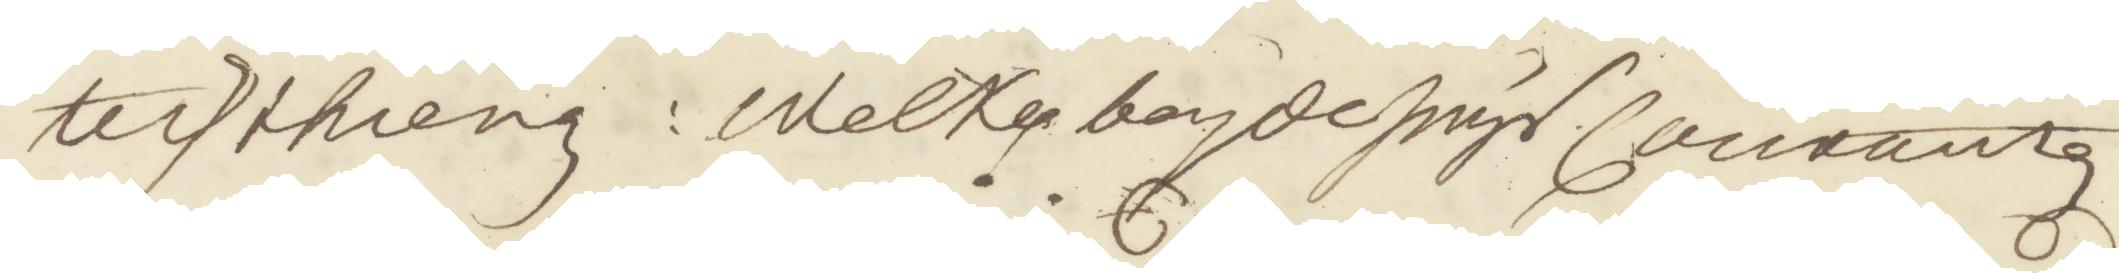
terverthieren: welke beijde prijs Couranten
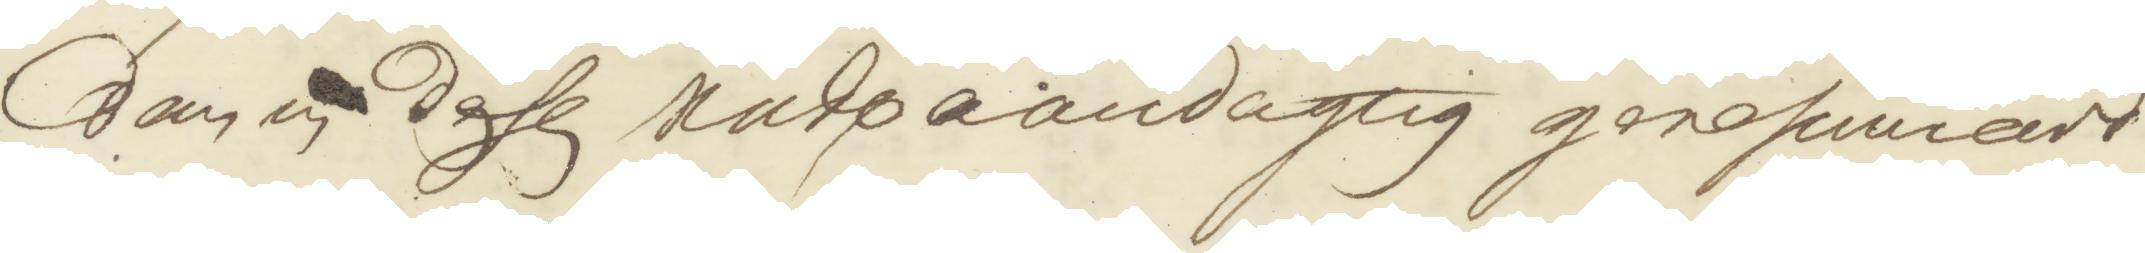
dan in desen rade aandagtig geresumeerd
